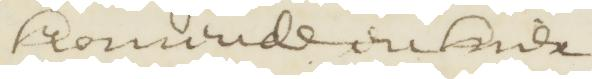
komende en hier
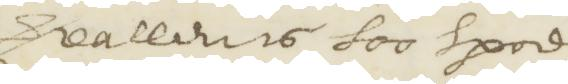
vervallen is Soo Spoe
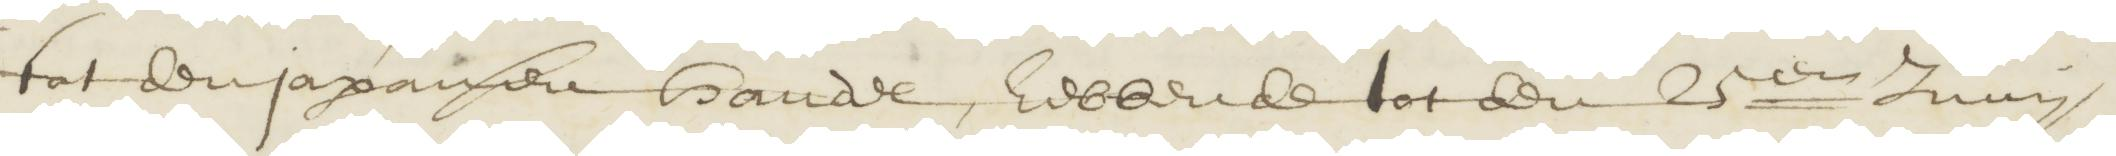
tot den japansen handel, hebbende tot den 25=en Junij
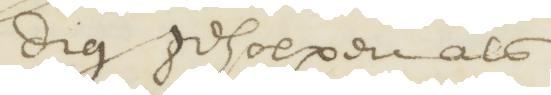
dig geholpen als
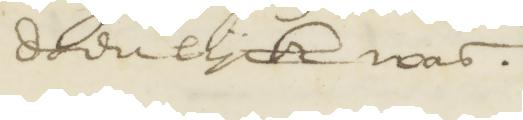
doenlijck was.
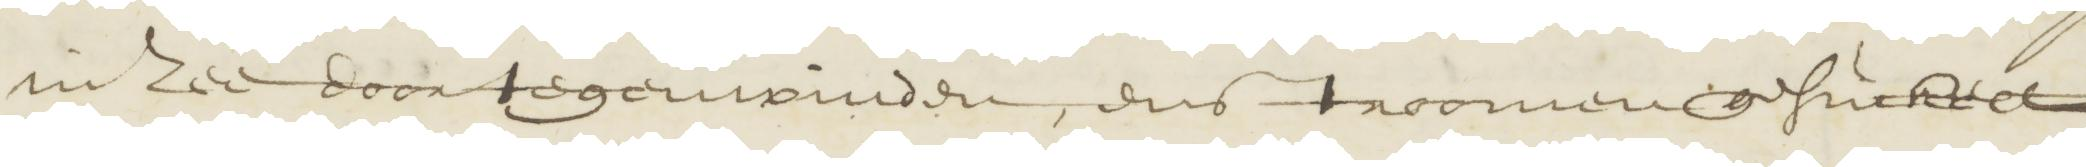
in zee door tegenwinden, enstroomen gesuckelt
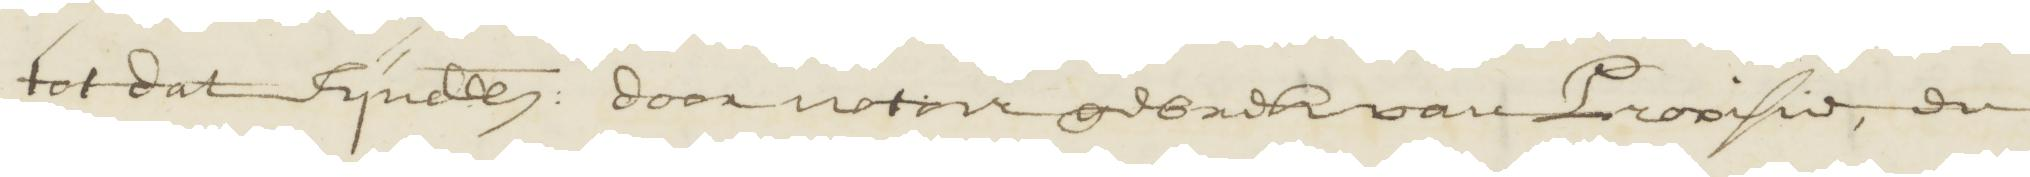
tot dat eijndelijk door notoir gebrek van Provisie, en
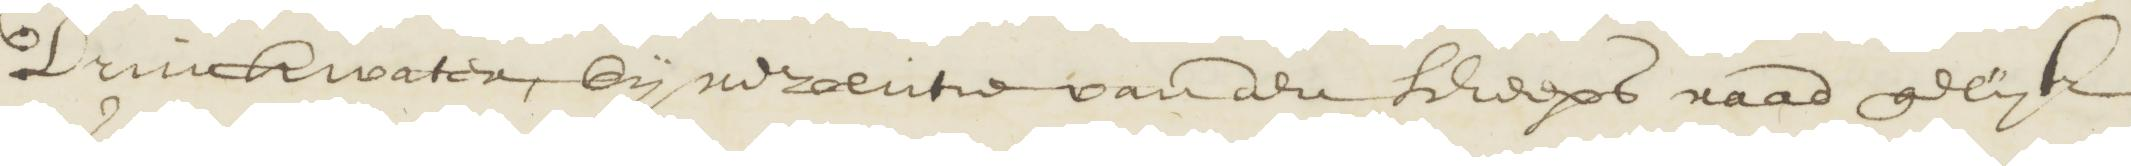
Drinckwater, bij rezolutie van den scheeps raad gelijk
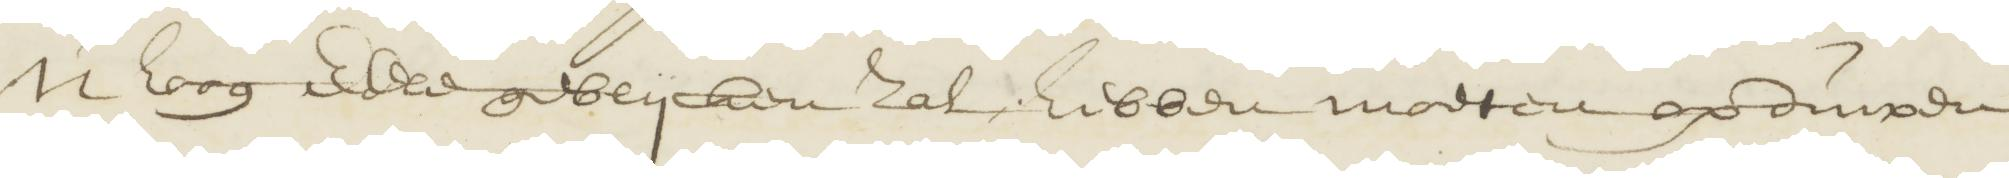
u hoog Edele geblijcken Zal, hebben moeten opduiven
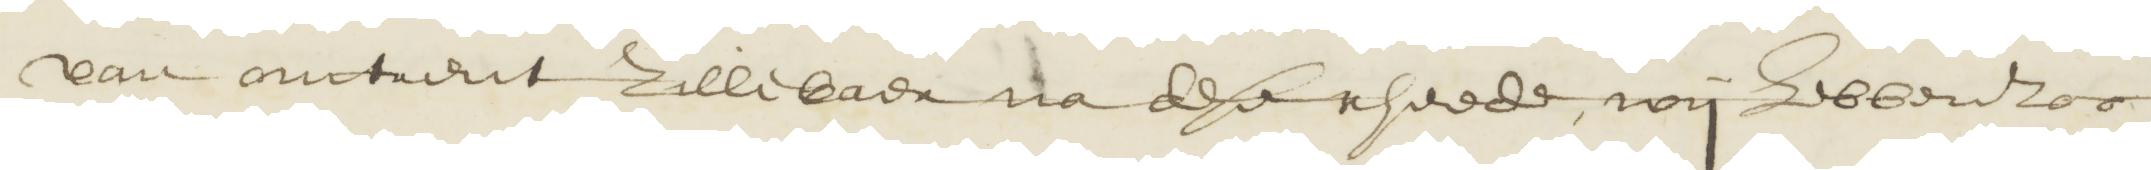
van omtrent Zillebaer na dese rheede, wij Hebben Zoo
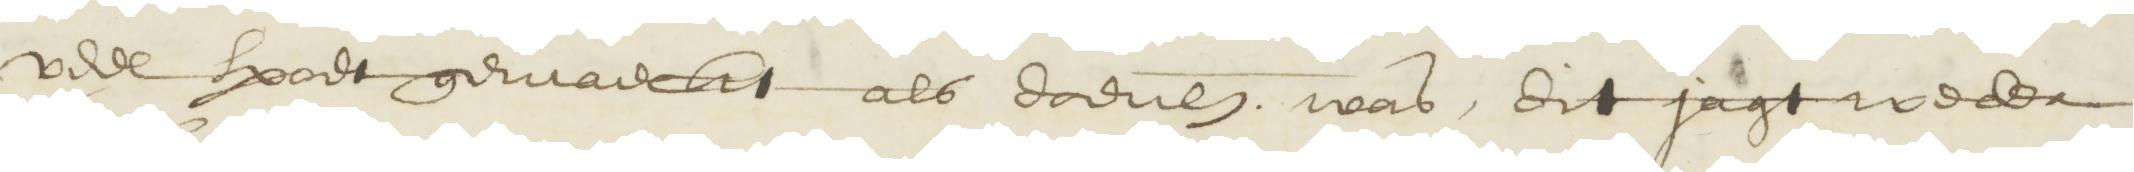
veel spoet gemaeckt als doenlijk was, dit jagt weder
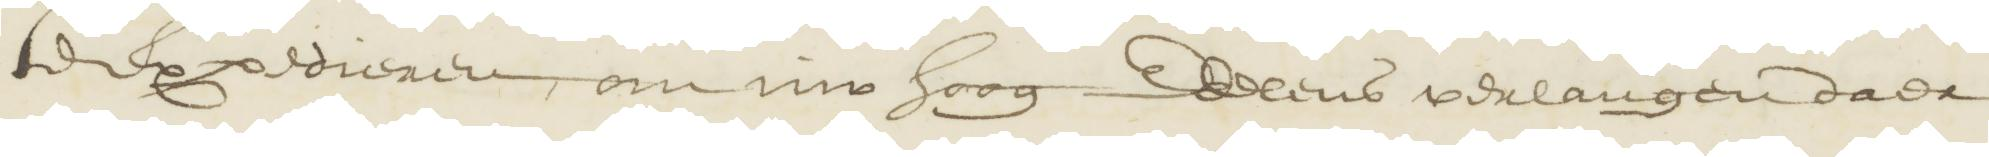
te Expedieren, om uw hoog Edelens verlangen daer
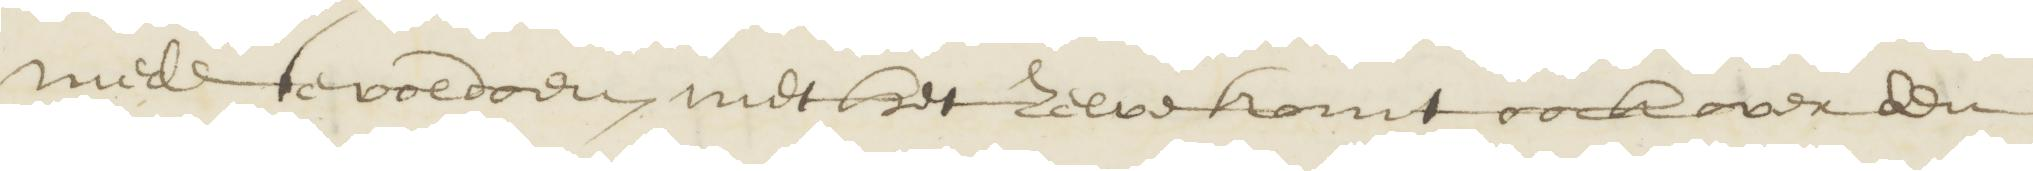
mede te voldoen, met het zelve komt oock over den
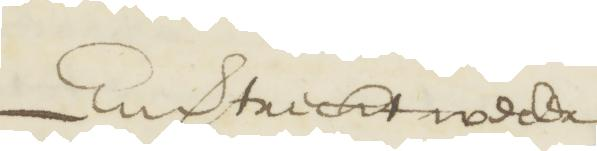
En vertreckt weder
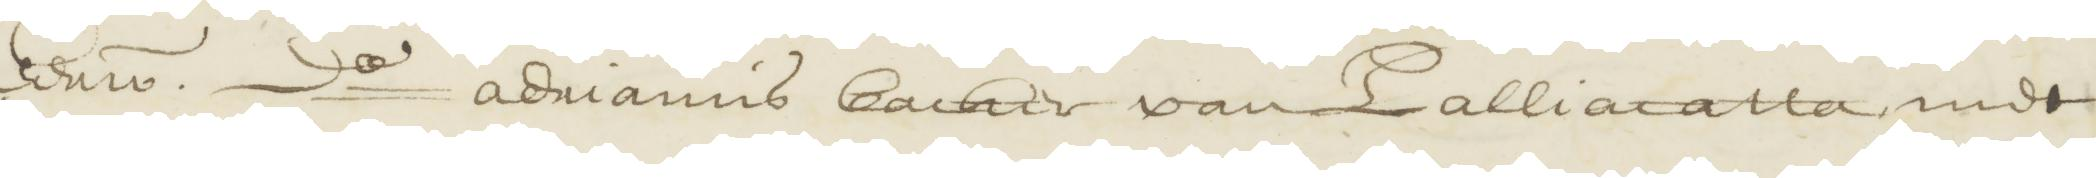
Eerw. D=o adrianus backer van Palliacatta, met
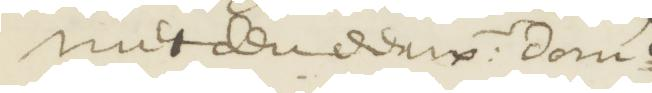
met den eerw: dom:e
